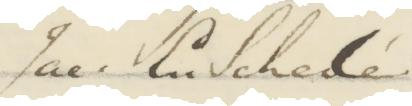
Jac. Enschedé
